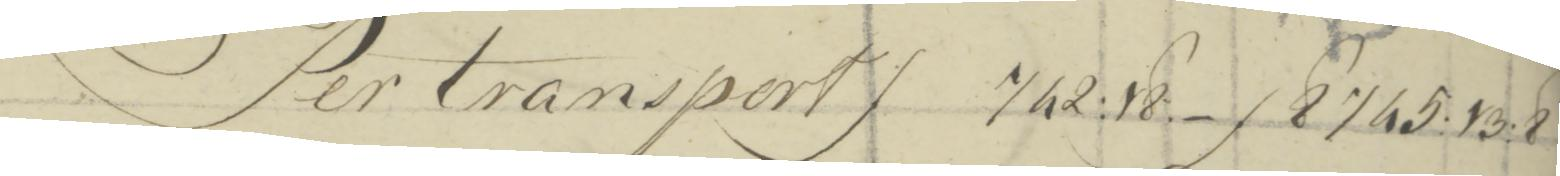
Per transport 742:18:— ƒ8745:13.8
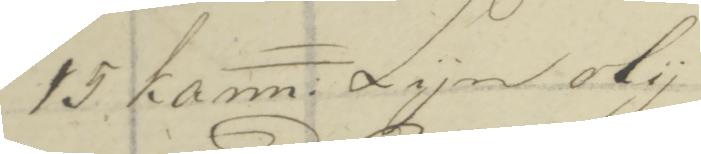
15 kann: Lijn olij
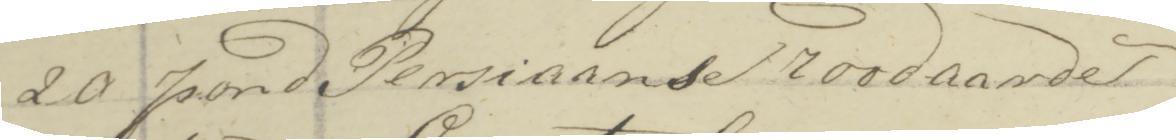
20 pond Persiaanse rood aarde
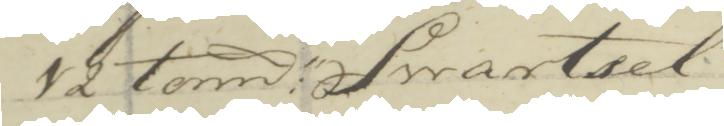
12 tonn: Swartsel
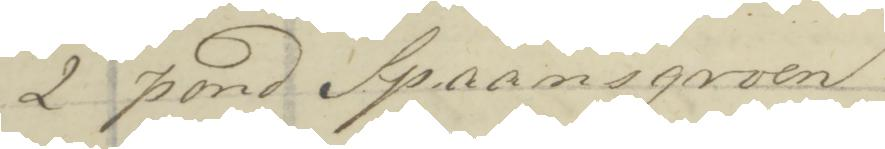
2 pond Spaans groen
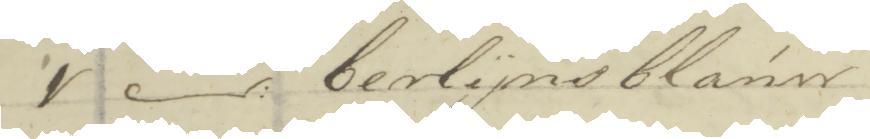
1 —: berlijns blauw
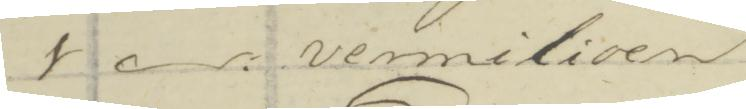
1 —: vermilioen
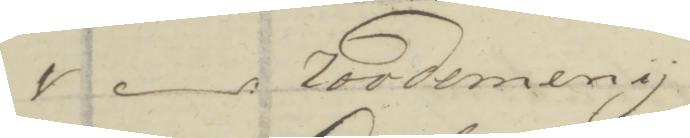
1 —: roode menij
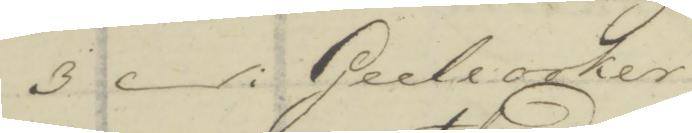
3 —: Geele ooker
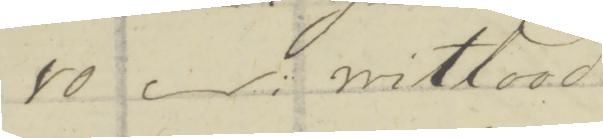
10 —: wit lood
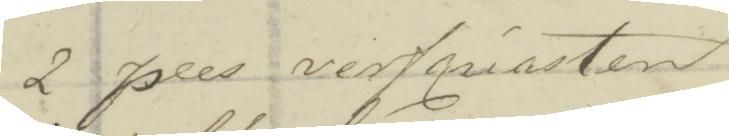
2 pees verfquasten
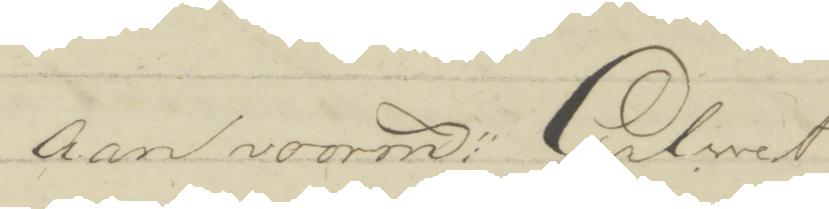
aan voorm: Galwet
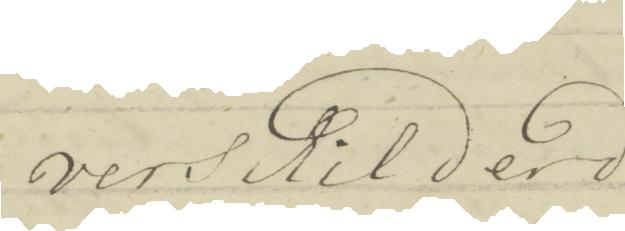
verschilderd
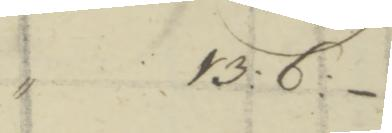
„ 13: 6:—
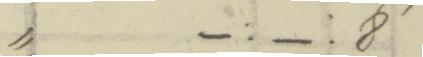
„ —:—:8
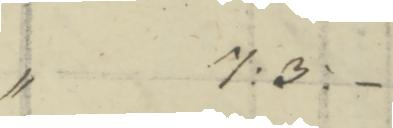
„ 7:3:—
